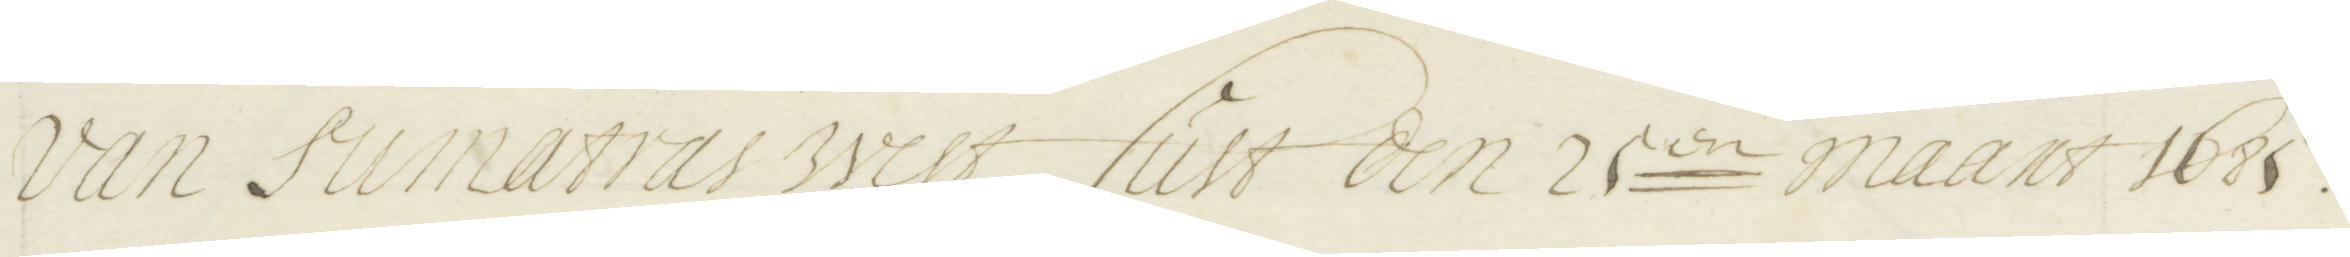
van Sumatras west Cust den 25=en maart 1685.
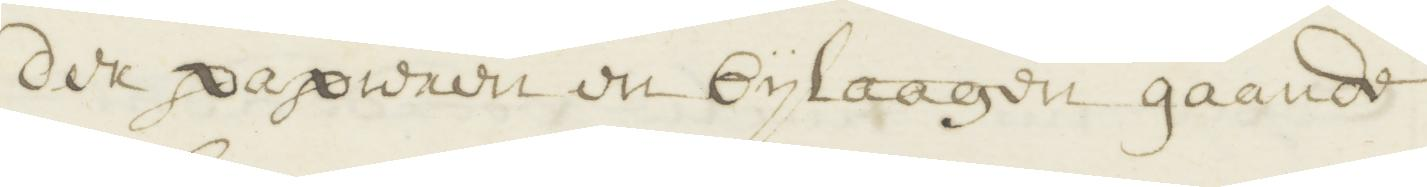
der papieren en bijlaagen gaande
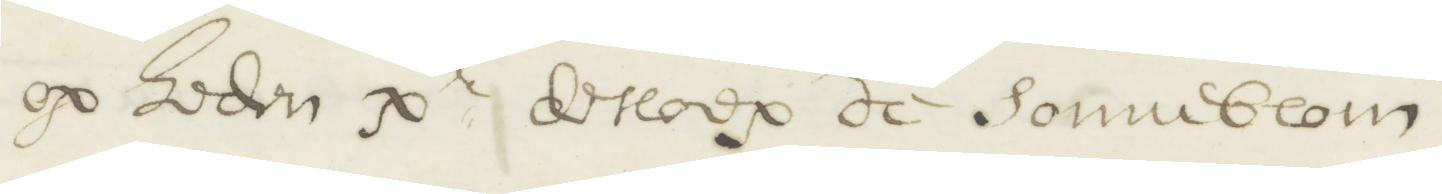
op heden p„r desloep de sonneblom
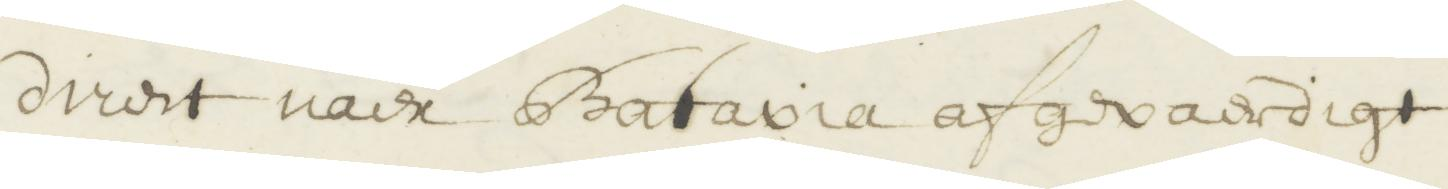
direct naer Batavia afgevaerdigt
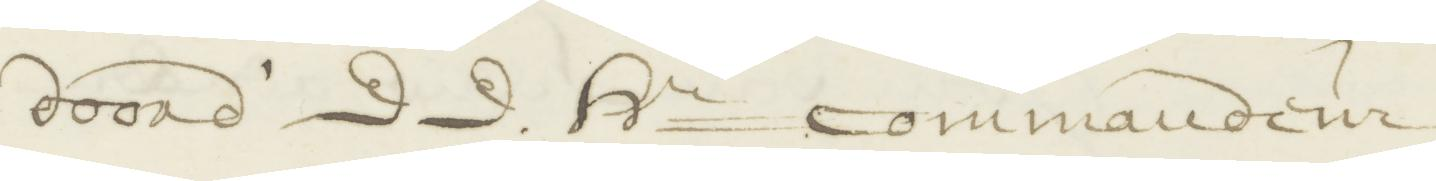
door d’ EE. H=r commandeur
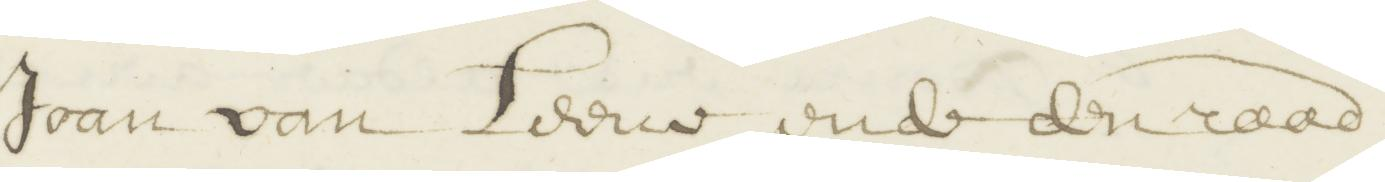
Joan van Leene ende den raad
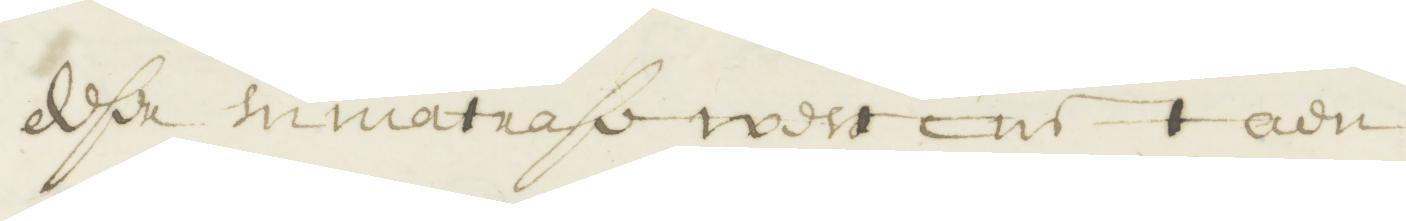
deser sumatrase westcust aen
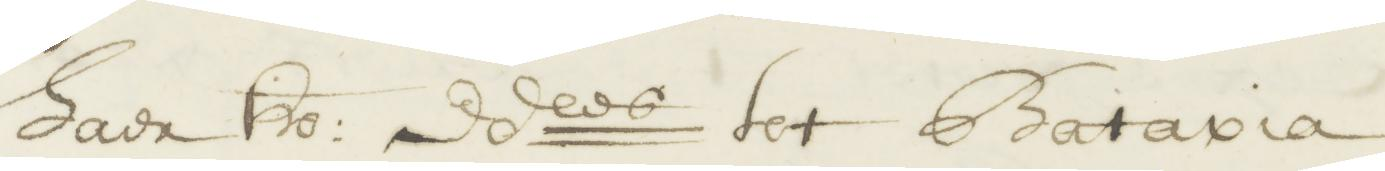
haer Ho: Ed=les tot Batavia
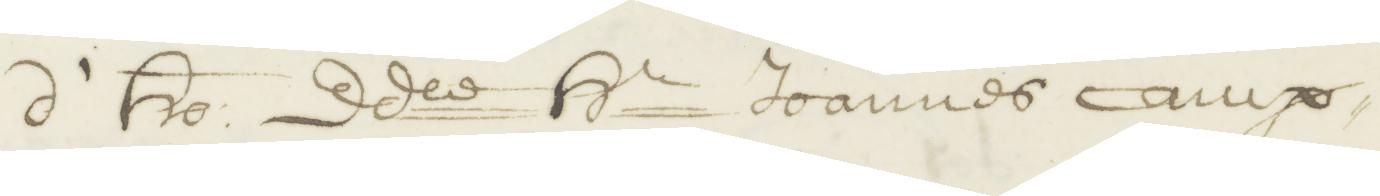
d’Ho: Ed=le H=r Joannes camp„
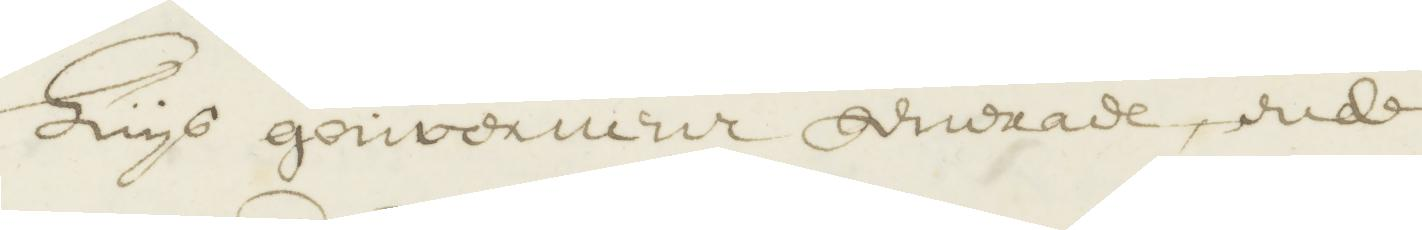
huijs gouverneur generael, ende
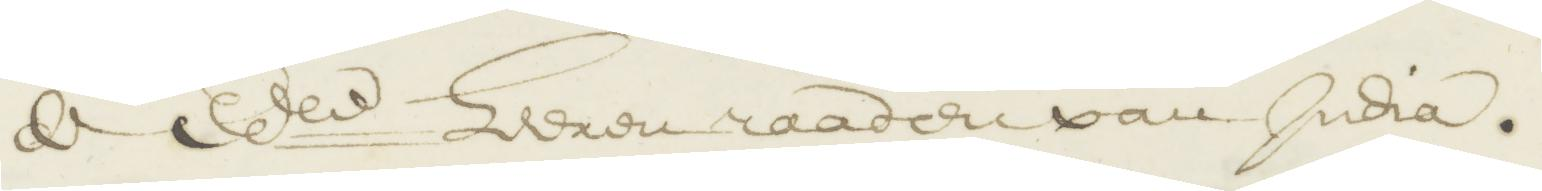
de Ed=le heeren raaden van jndia.
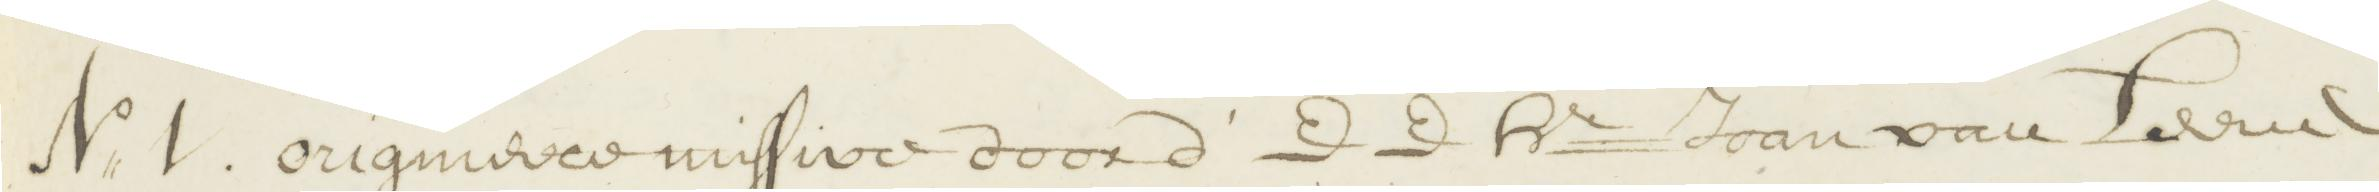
N„o 1. origineele missive door d’ E E H=r Joan van Leene
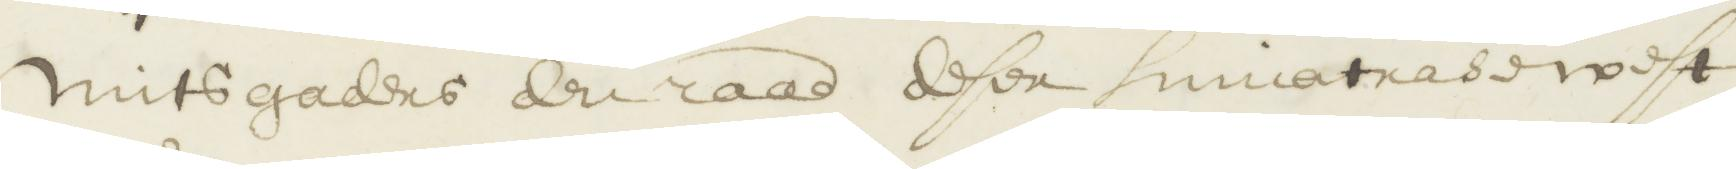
mitsgaders den raad deser sumatrase west
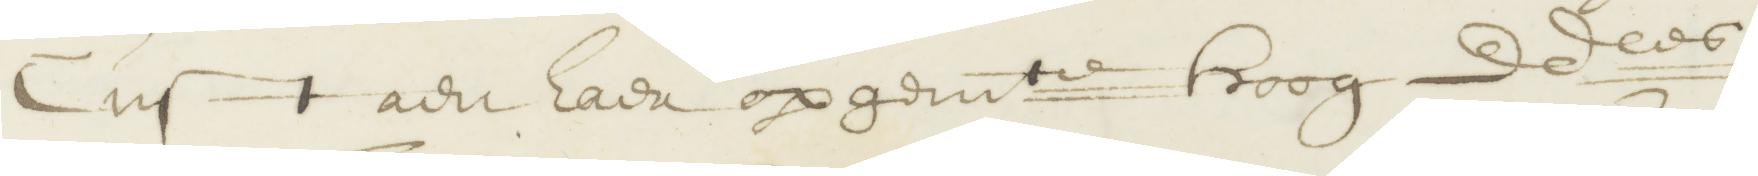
Cust aen haer opgem=te Hoog Ed=les
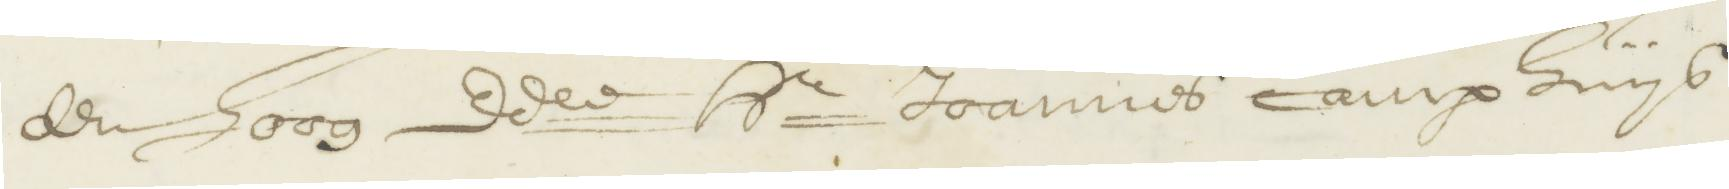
den hoog Ed=le H=r Joannes camphuijs
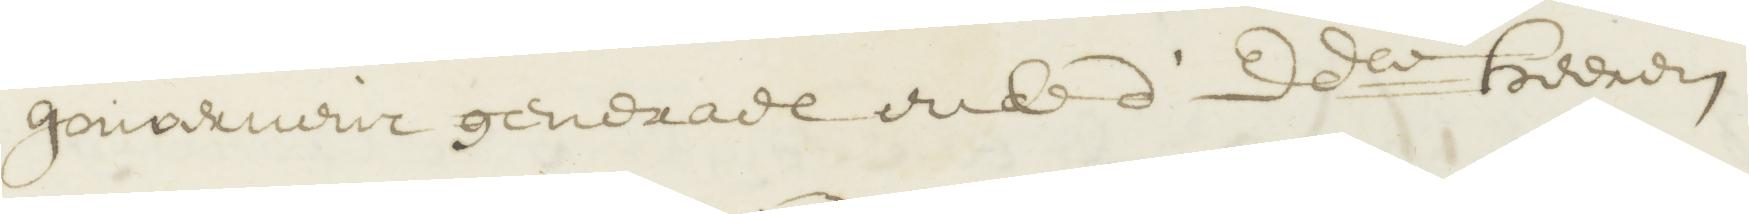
gouverneur generael ende d’ Ed=le heeren
